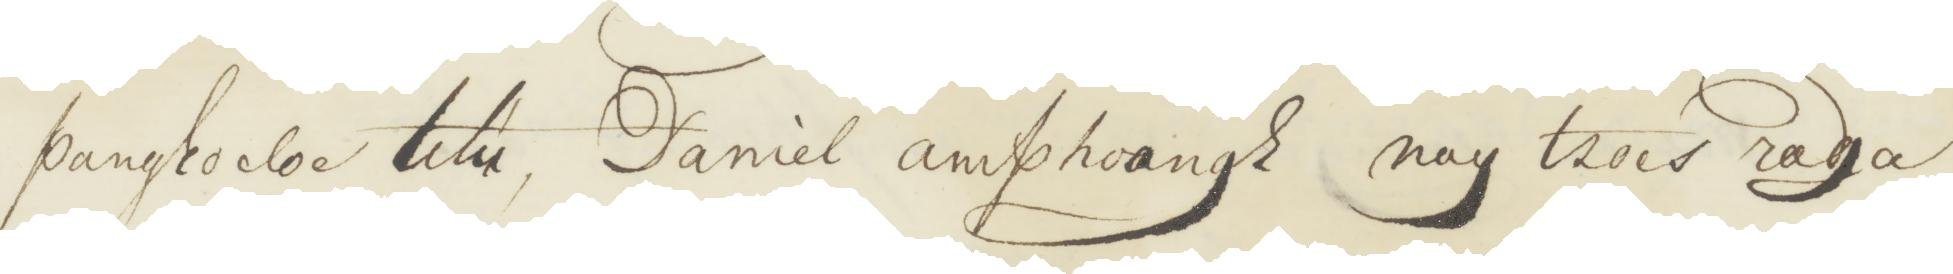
panghoeloe titu, Daniel amphoangh nay troes radja
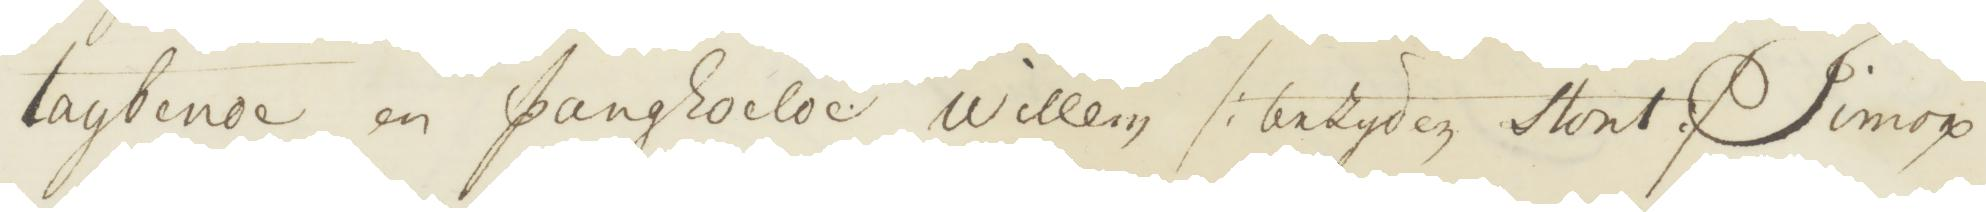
taybenoe en panghoeloe willem /:terzijden stont:/ Timor
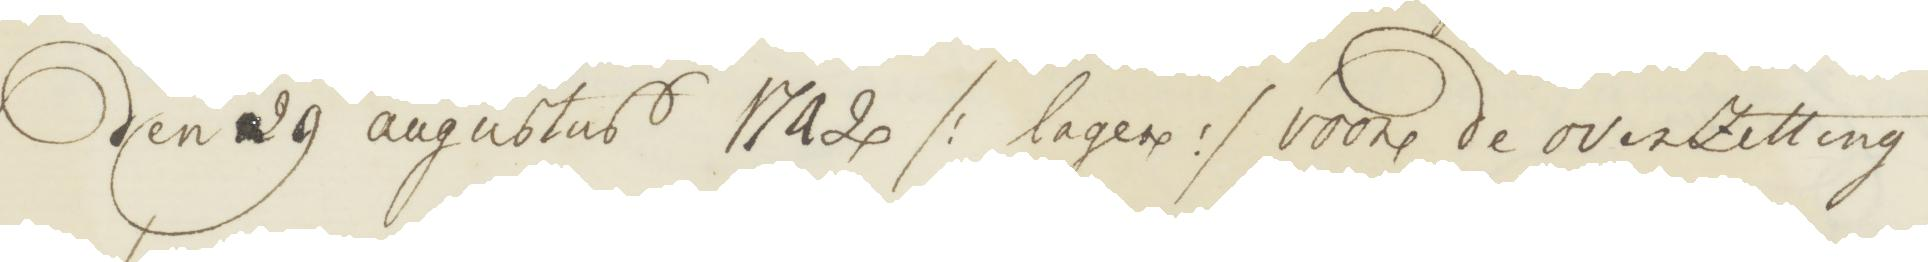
den 29 augustus 1742 /: lager:/ voor de overzetting
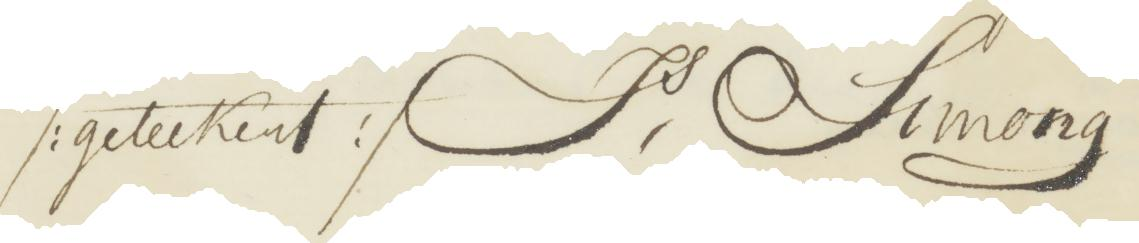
/:geteekent:/ J„s Simong
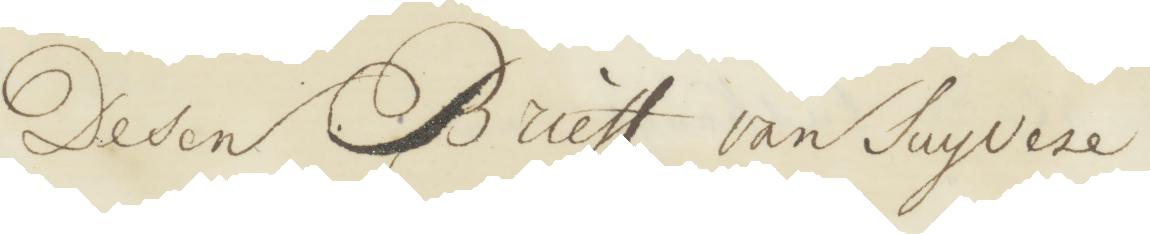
Desen Brieff van suyvere
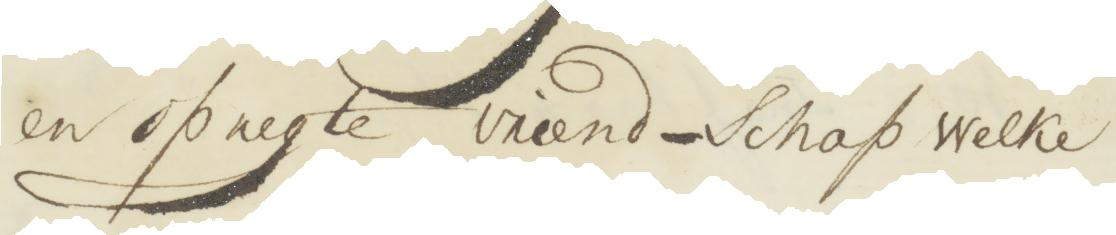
en op regte vriend-schap welke
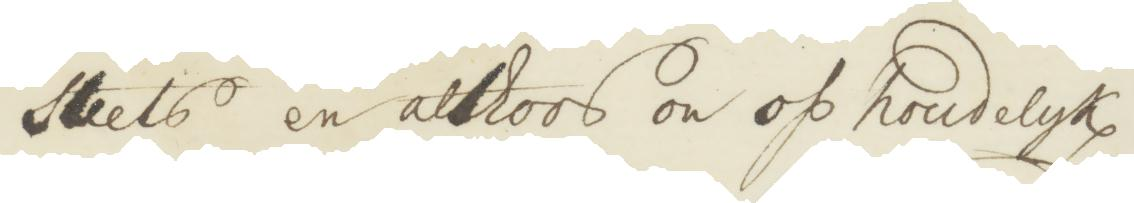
steets en althoos on op houdelijk
